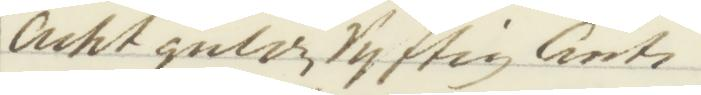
Acht gulden Vyftig Cents
